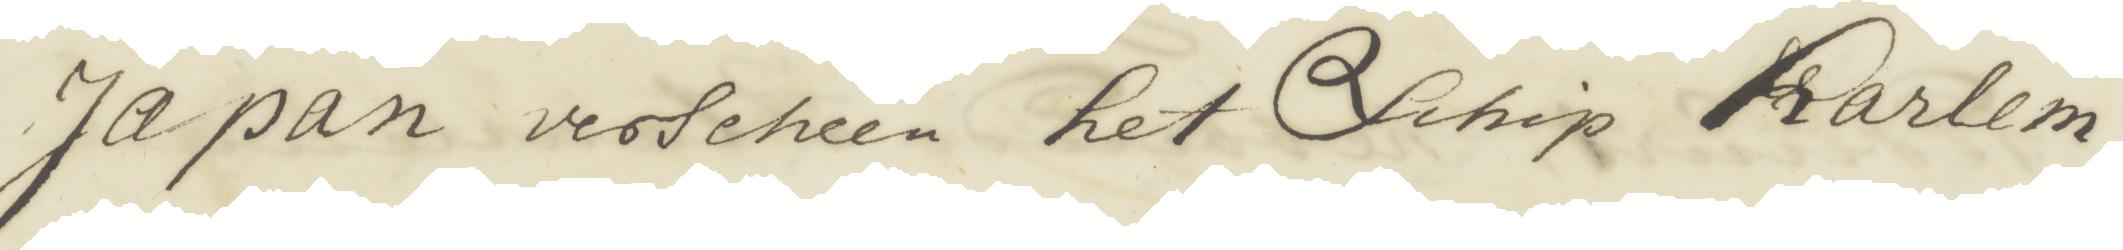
Japan verscheen het schip Harlem
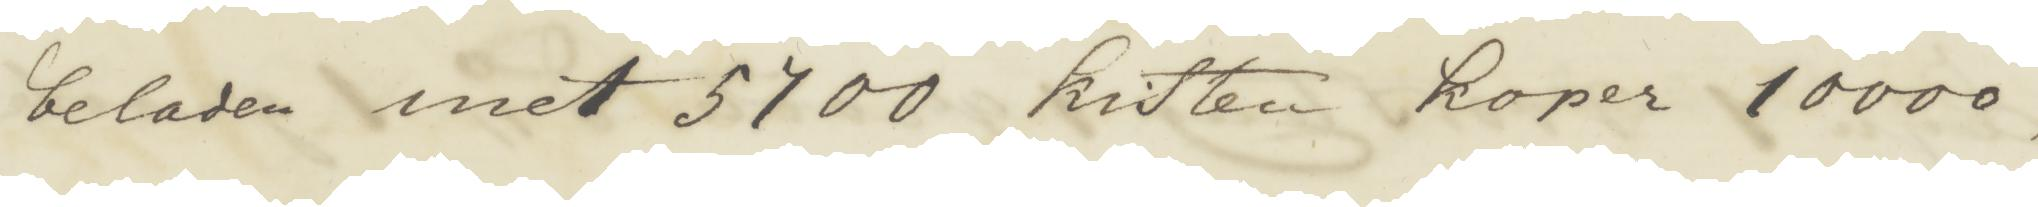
beladen met 5700 kisten koper 10'000,
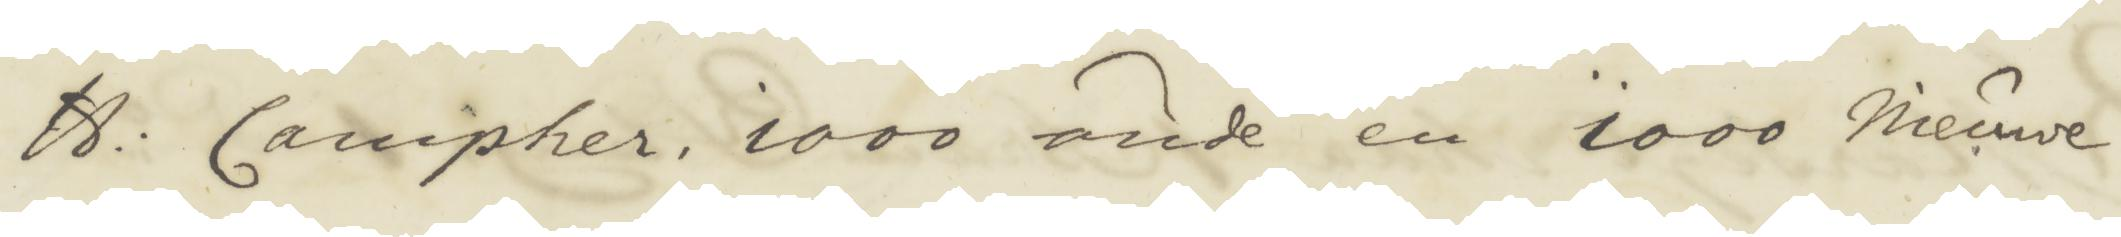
lb: Campher, 1000 oude en 1000 nieuwe
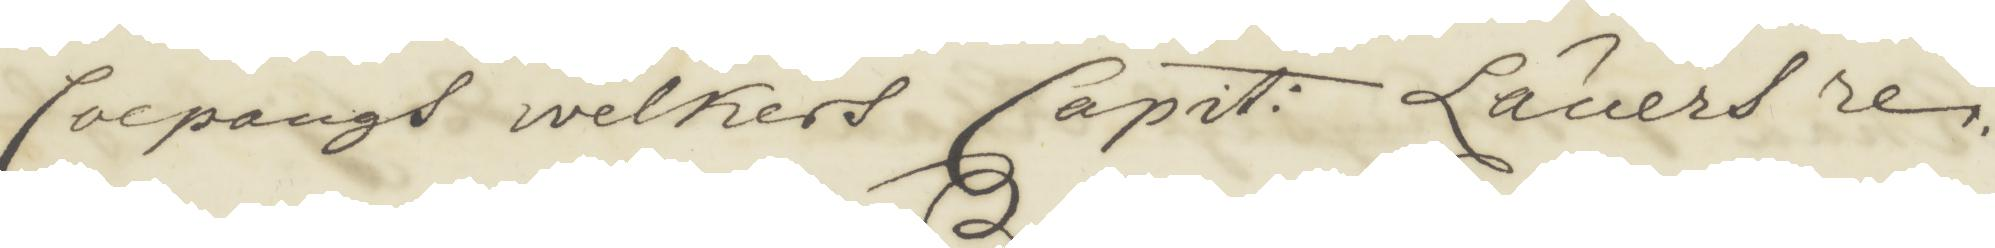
Coepangs welkers Capit: Lauers re„
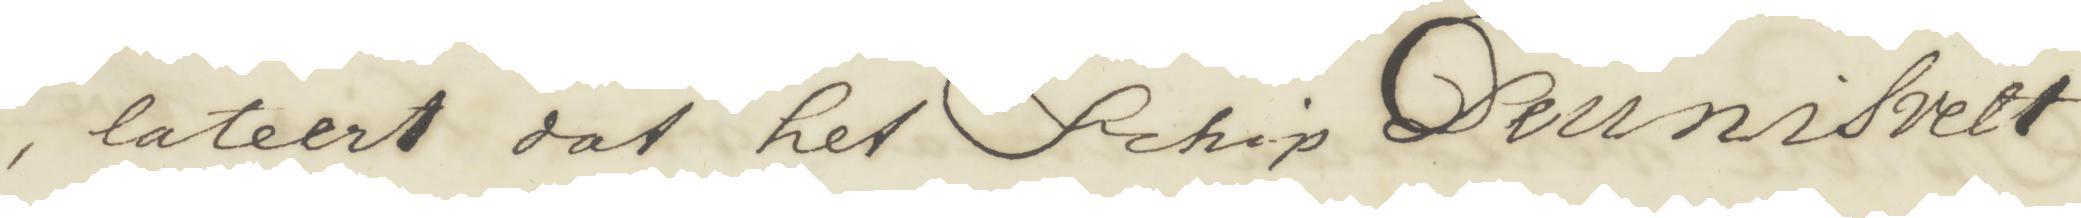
,lateert dat het schip Leunisvelt
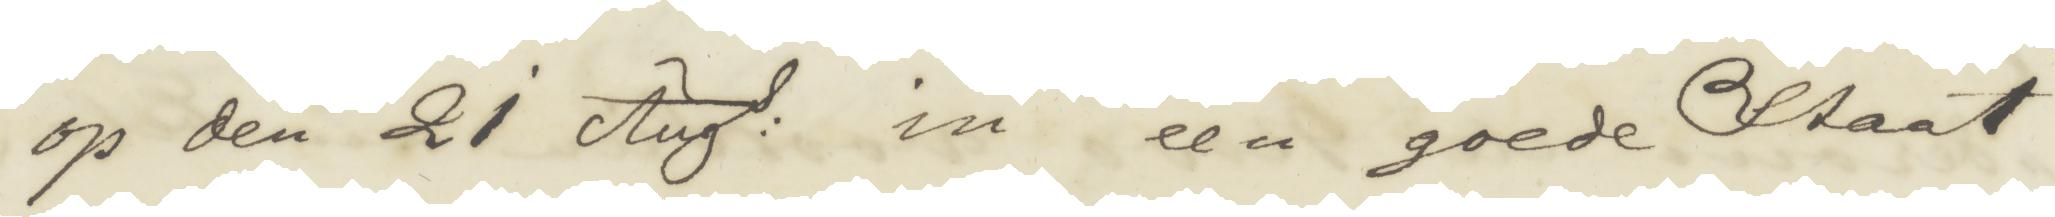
op den 21 Aug:s in een goede Staat
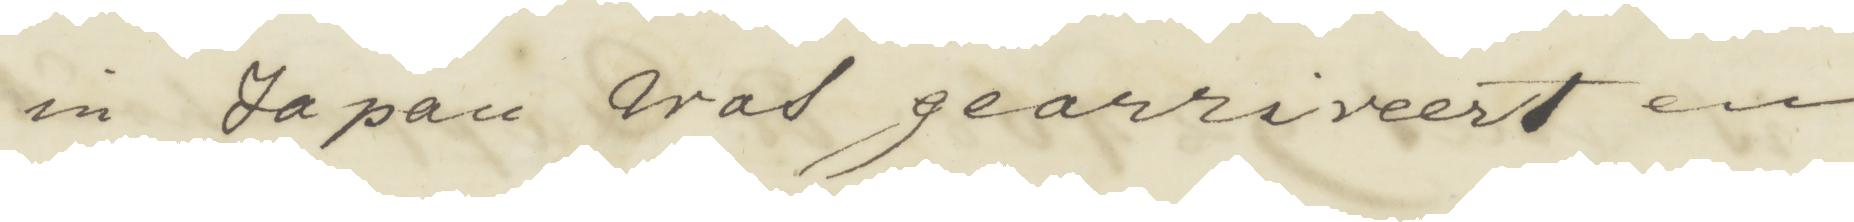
in Japan was gearriveert en
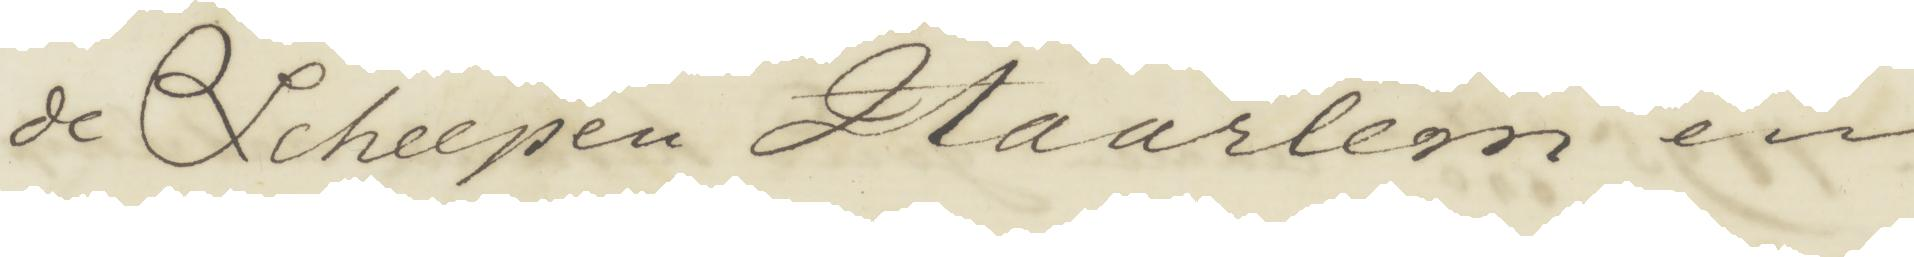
de scheepen Haarlem en
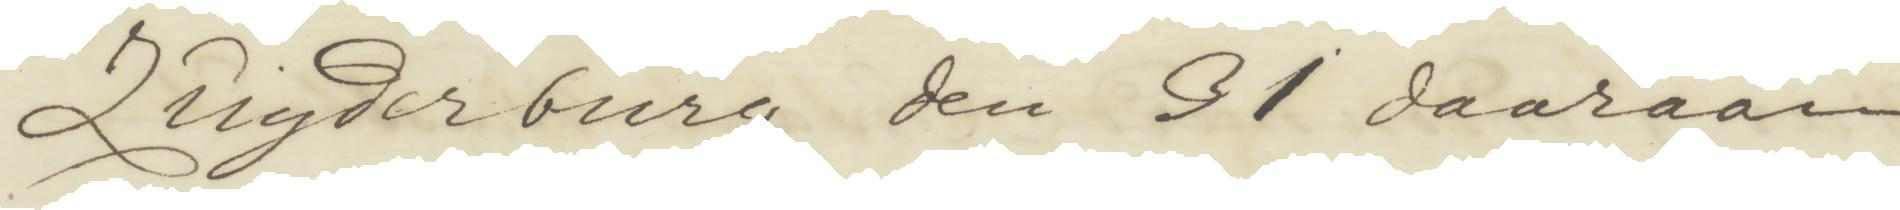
Zuyderburg den 31 daaraan
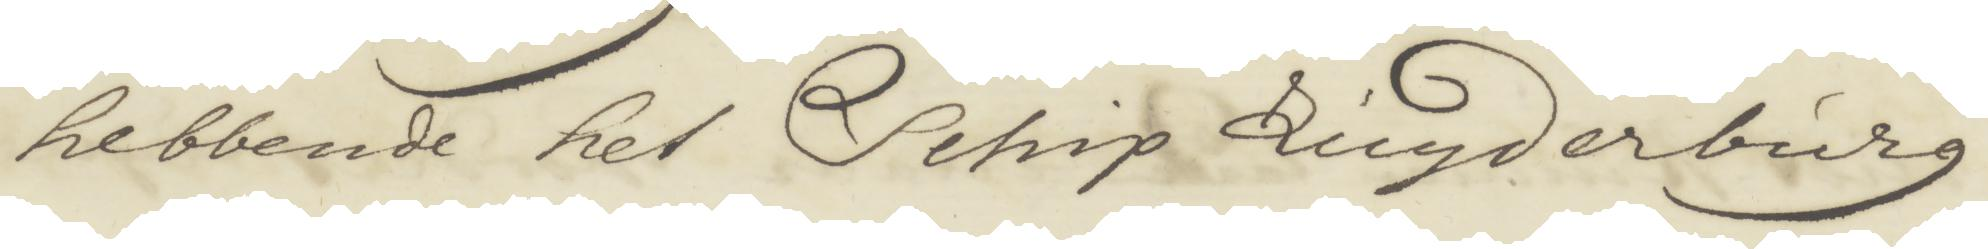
hebbende het schip Zuyderburg
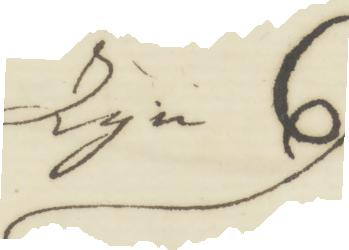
zijn 6
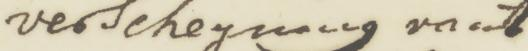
verscheyning van ’t
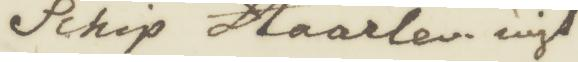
schip Haarlem uijt
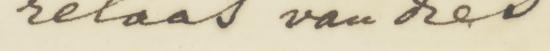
relaas van dies
